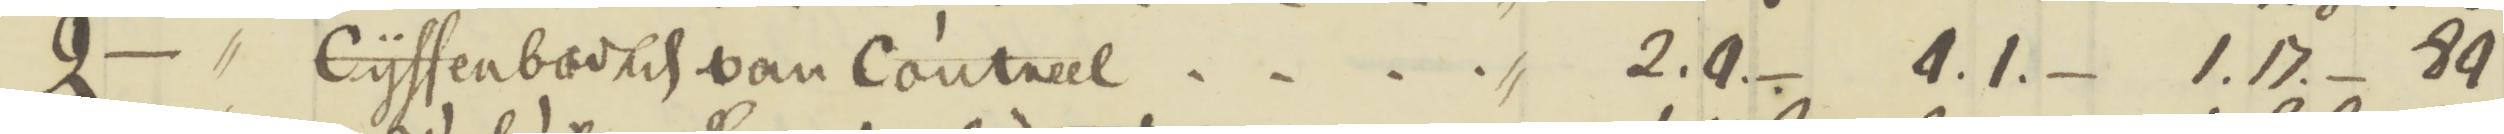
9— „ Cijfferboeken van Coutreel . . . . „ 2 4.— 4.1.— 1.17.— 84
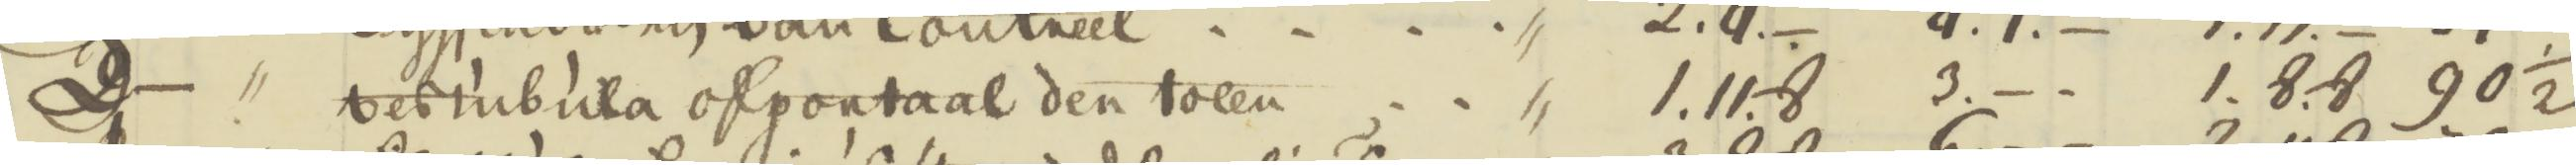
2— „ vestubula of portaal der tolen . . „ 1.11.8 3.——1.8.8 90: ½
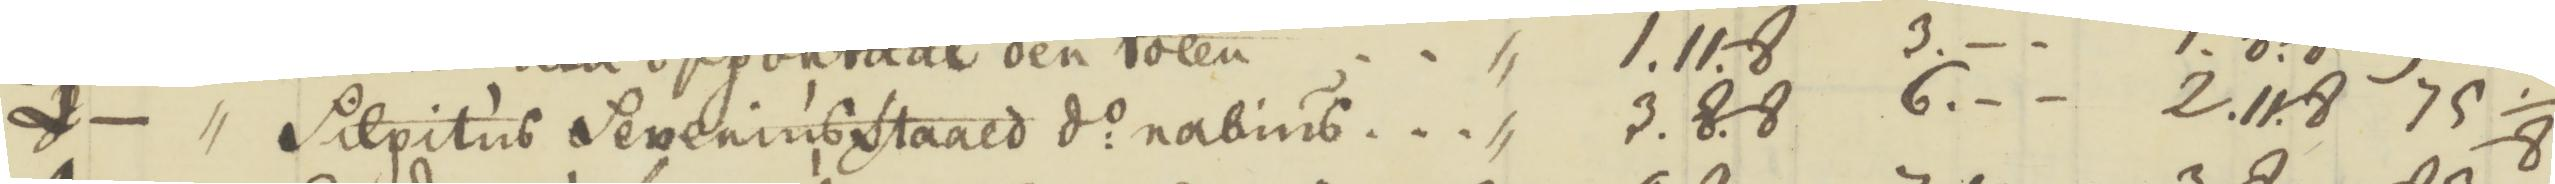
1„ Silpitus Severius vertaald d:o rabius . . . „ 3.8.8 6.— — 2.11.8 75 1/8
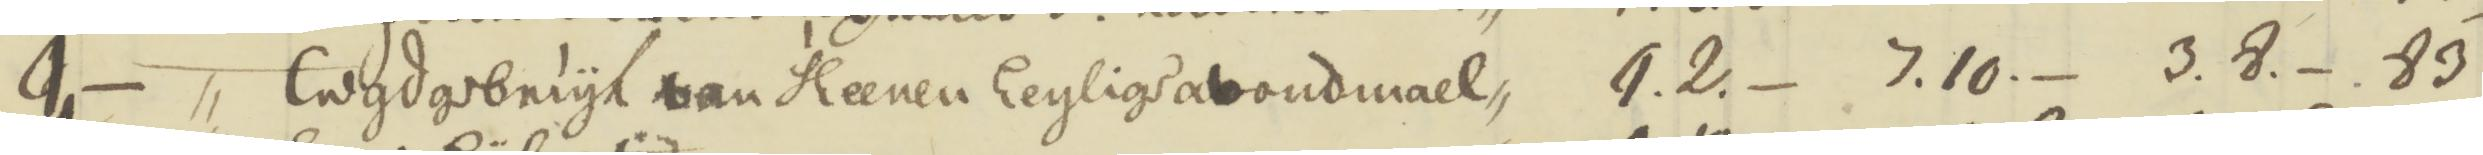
4— „ tregd gebruijk van'sheeren heylige avondmael„ 4.2.— 7.10. — 3.8.— . 83
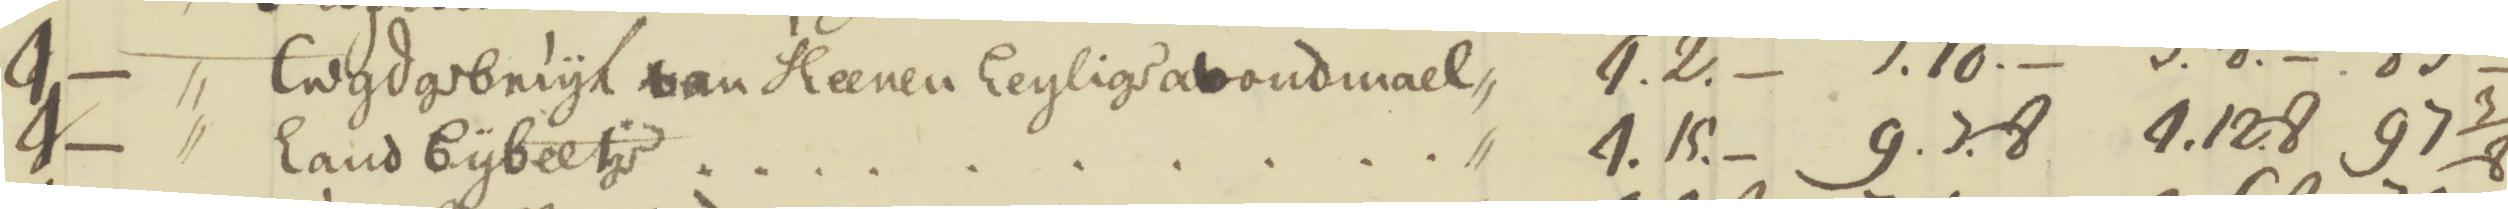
4— „ hand bijbeltje . . . . . . . . . . „ 4. 15:— 9.7.8 4.12.8. 97 3/8
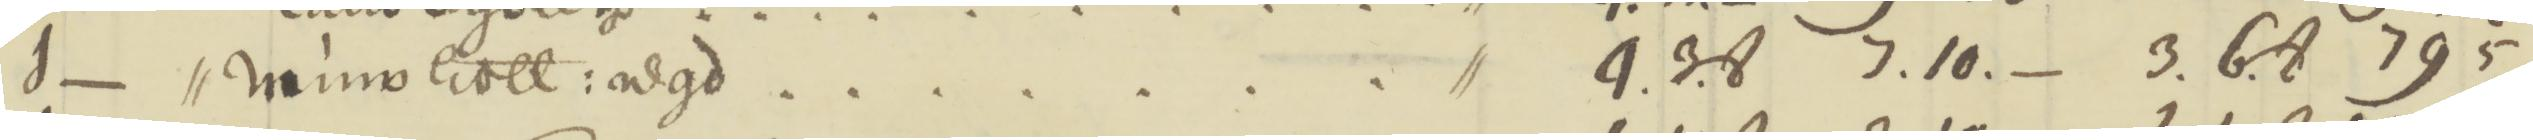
1. „niuw holl: regd. . . . . . . „ 4.3.8 7.10.— 3.6.8 79 5/8
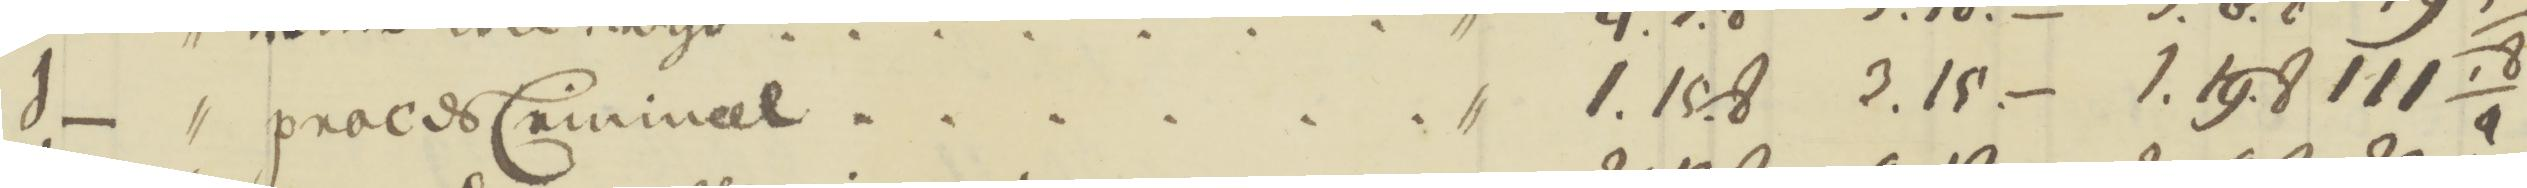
1 „ proces Crinineel . . . . . . „ 1. 15.8 3.15.— 1.19.8 111 18¼
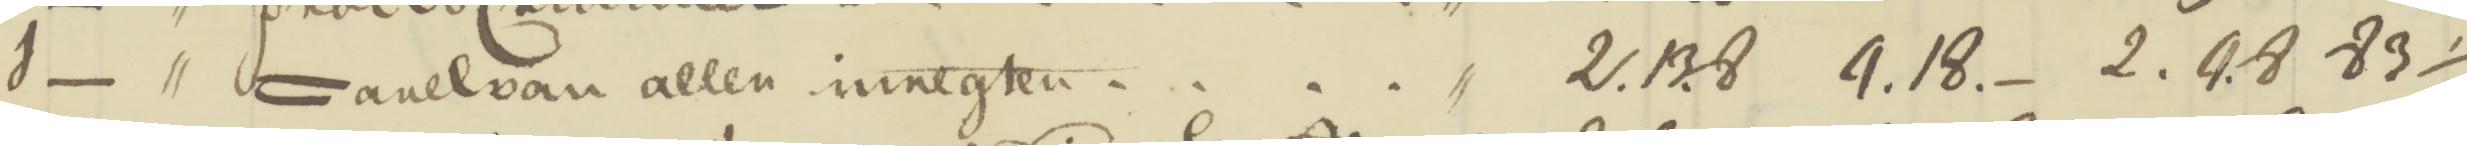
1 – „ Carel van allen inregten. . . . „ 2.13.8 4.18.— 2.4.8 83 1/8
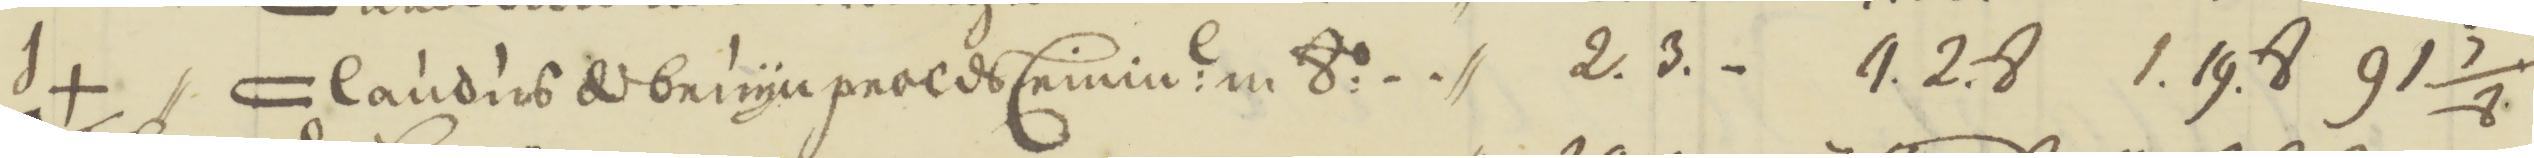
1 — „ Claudus de bruijn proces Crinin:l in d:o - - „ 2. 3.— 4.2.8 1.19.8 91 7/8
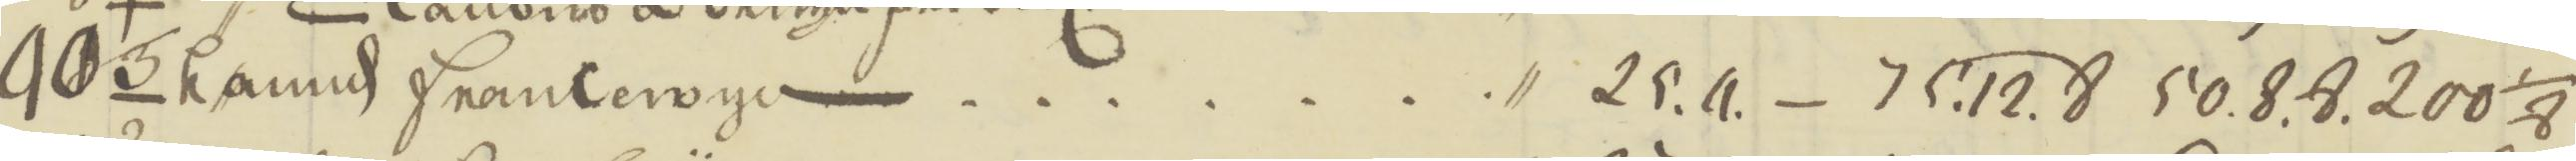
40 1/3 kannen France wyn „ 25.4.— 75.12.8 50.8.8.200 1/8
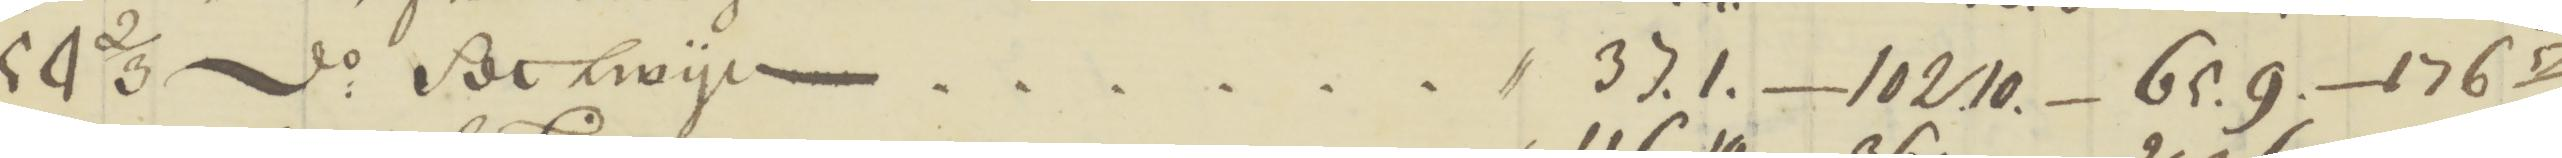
54 2/3 d:o seckwijn . . . . . . „ 37.1. 102.10. — 65.9.—176 5/8
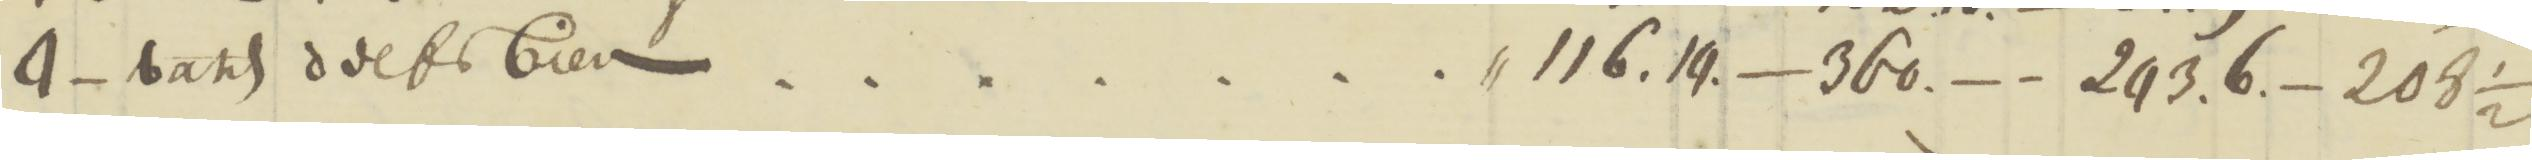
4– vaten delfs bier . . . . . . . „ 116.14:—360.—- 243.6. —208½
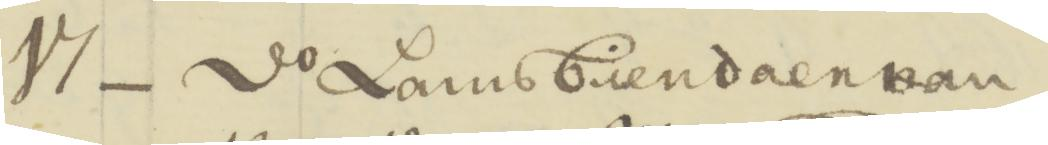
17— D:o Lamsbier daer van
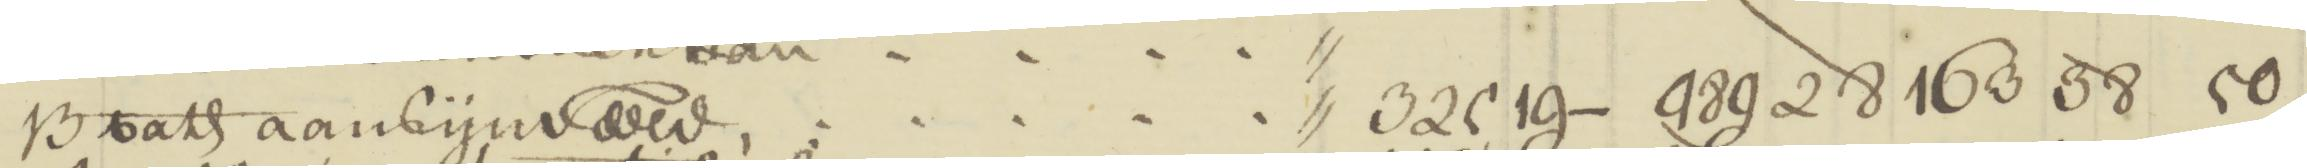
13 vaten aan sijn Edele , . . . . . „ 325 19— 489 2 8 163 38 50
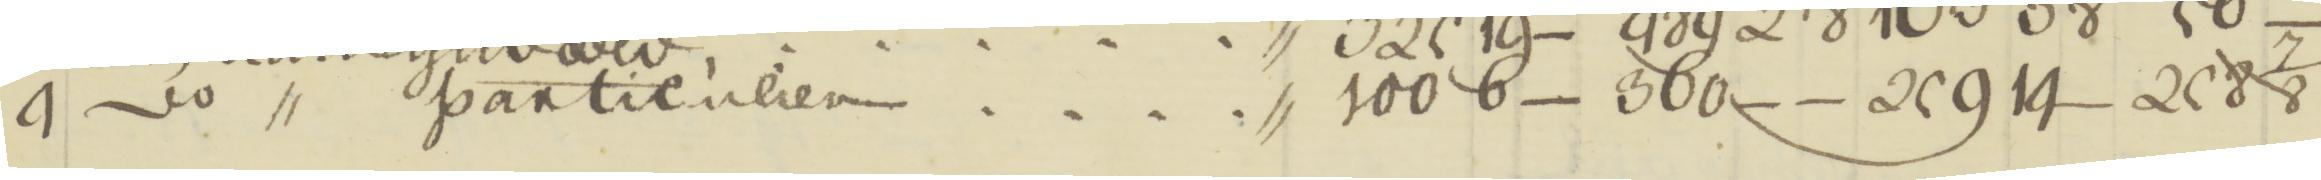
4 do „ particulier . . . . „ 100 6— 360——259 14— 258 7/8
